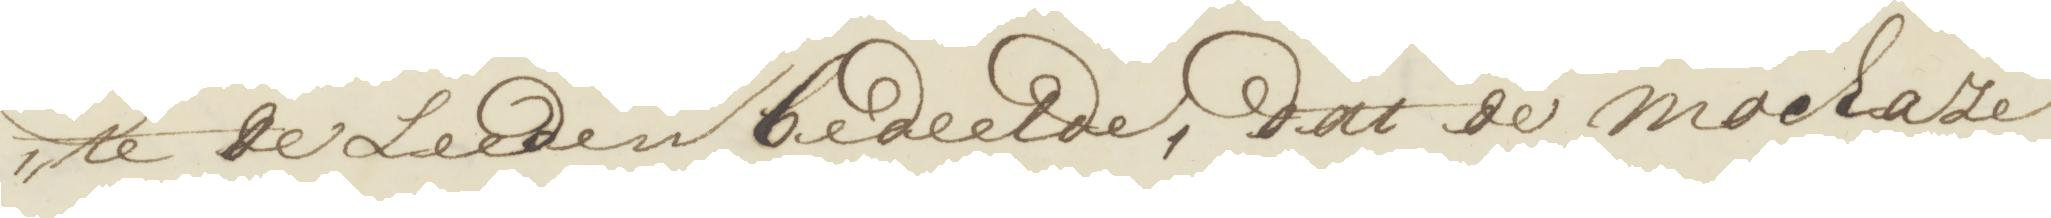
„te de Leeden bedeelde, dat de mochaze
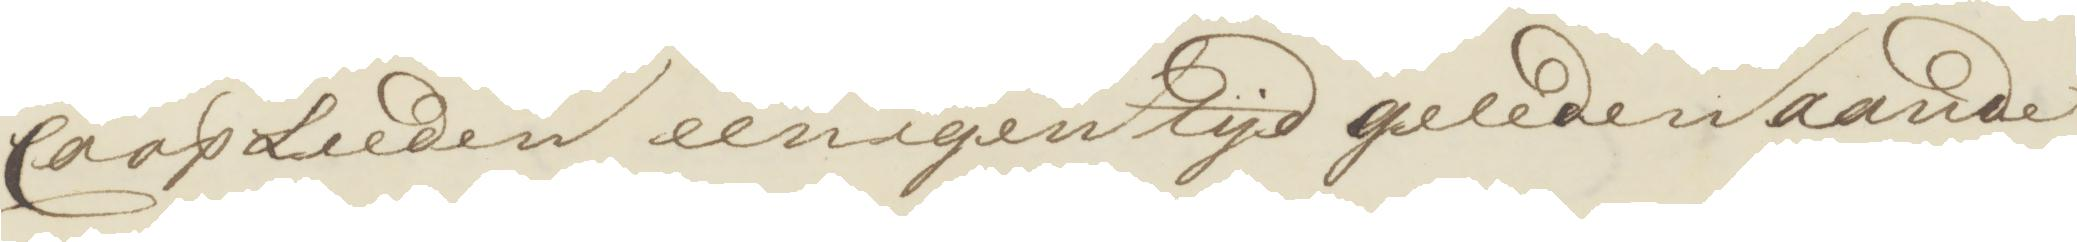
Cooplieden eenigen tijd geleden aande
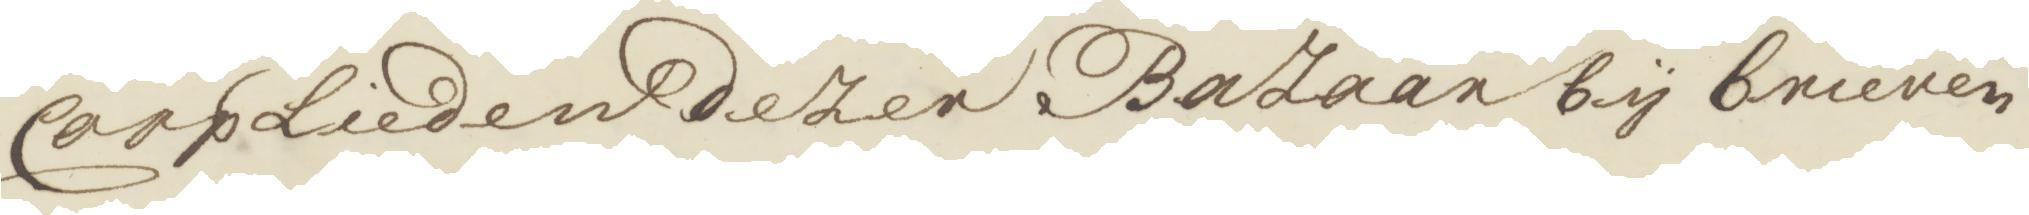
Cooplieden dezer Bazaar bij brieven
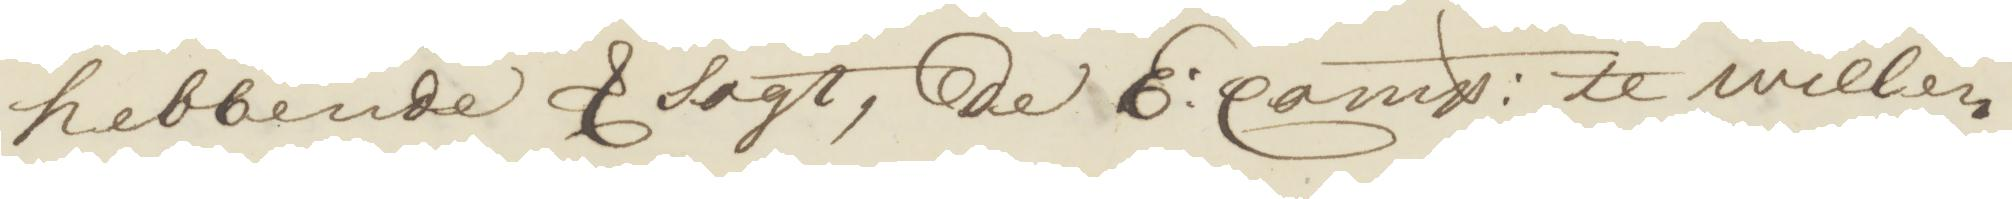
hebbende versogt, de E: Comp: te willen
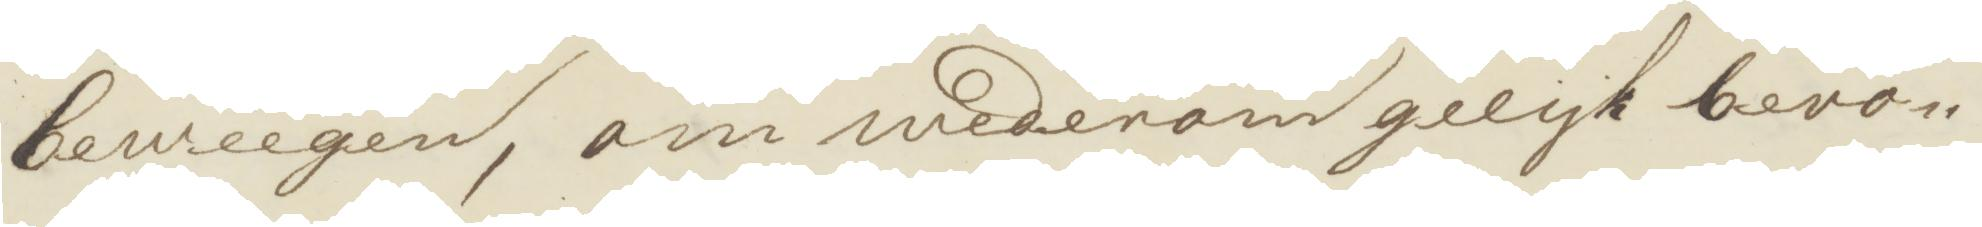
beweegen, om wederom gelijk bevo
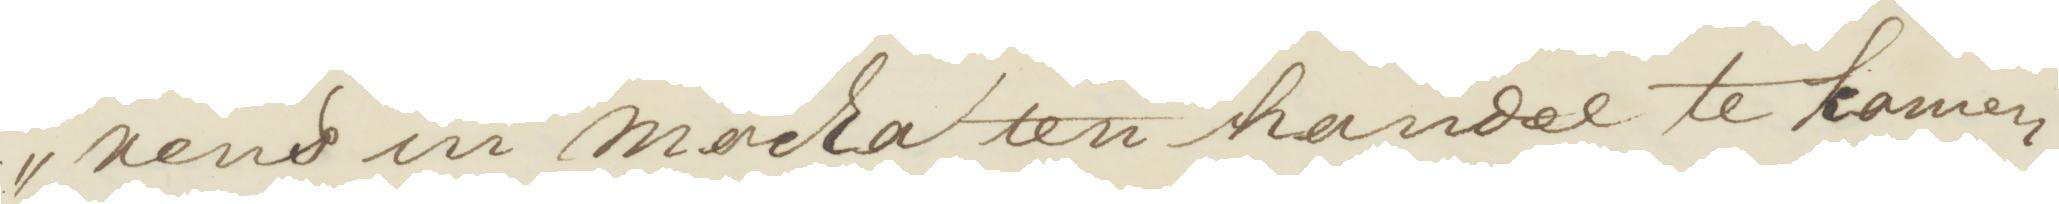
„rens in mocha ten handel te komen
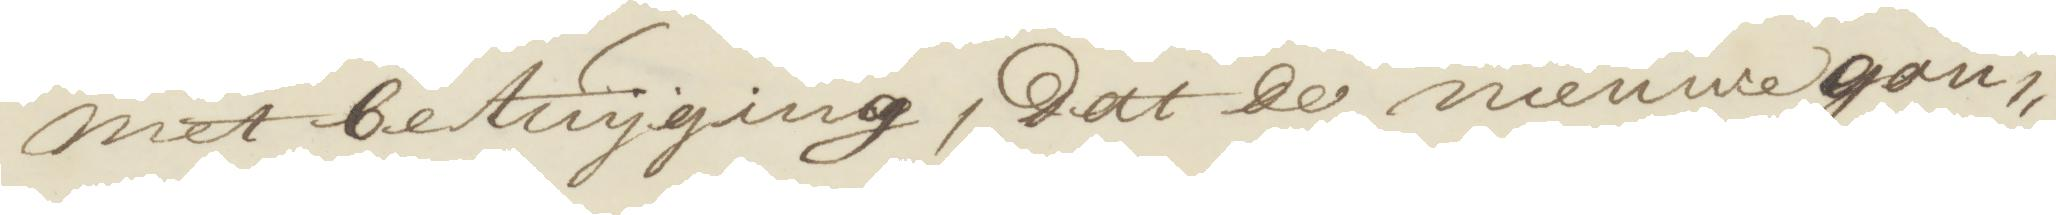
met betuijging, dat de nieuwe gou„
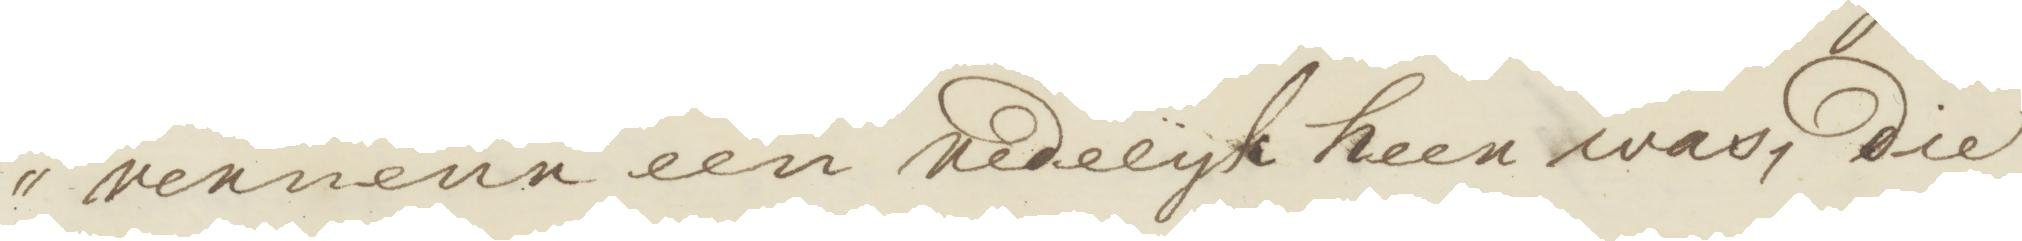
„verneur een redelijk heer was, die
